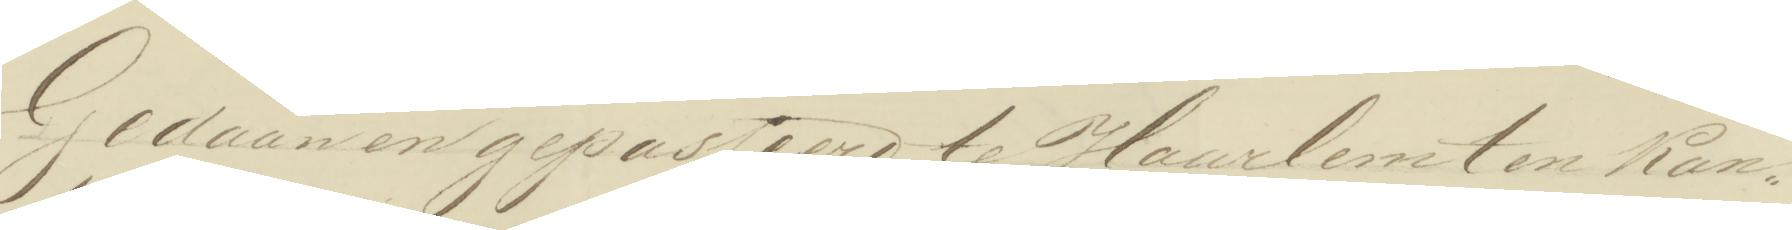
Gedaan en gepasseerd te Haarlem ten Kan„
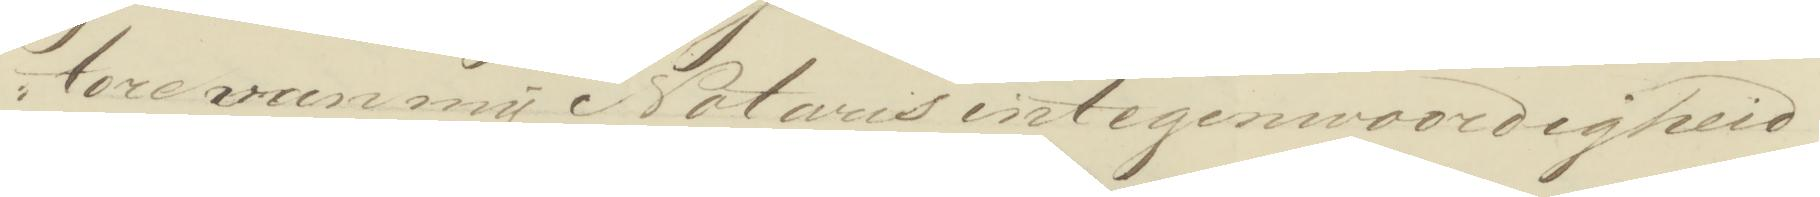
„tore van mij Notaris integenwoordigheid
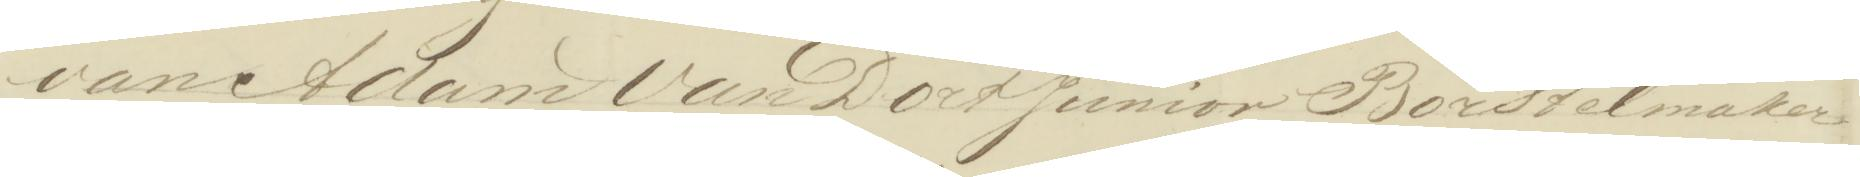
van Adam Van DortJunior Borstelmaker
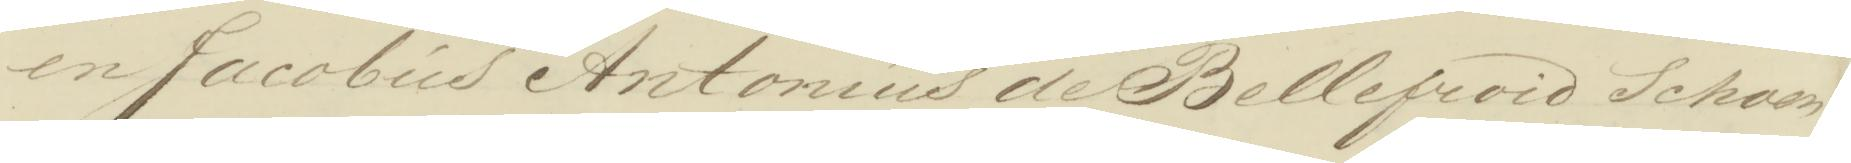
en Jacobus Antonius de Bellefroid schoen
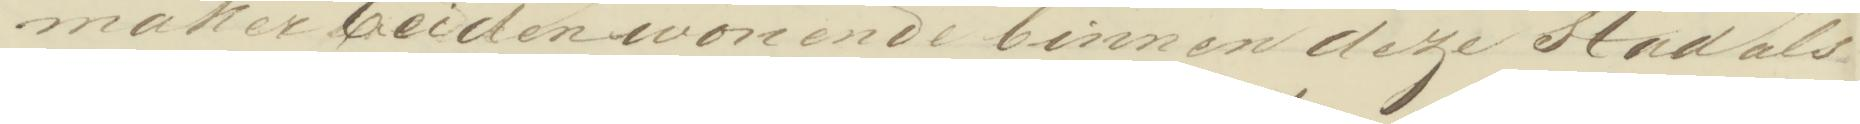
maker beiden wonende binnen deze stad als
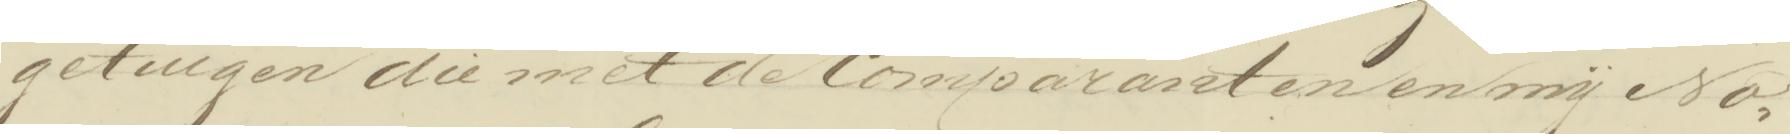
getuigen die met de Comparanten en mij No„
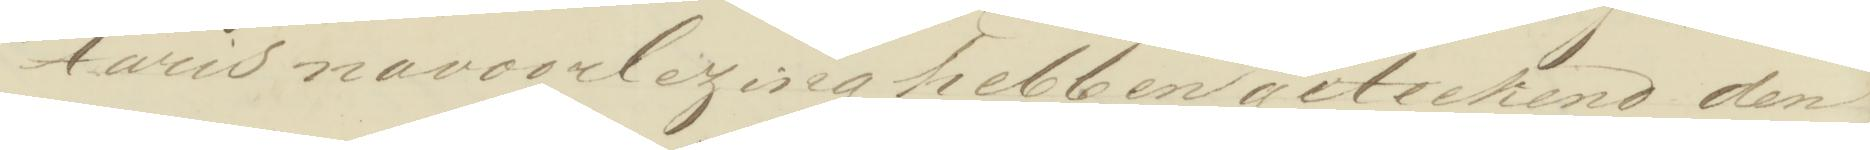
=taris navoorlezing hebben geteekend den
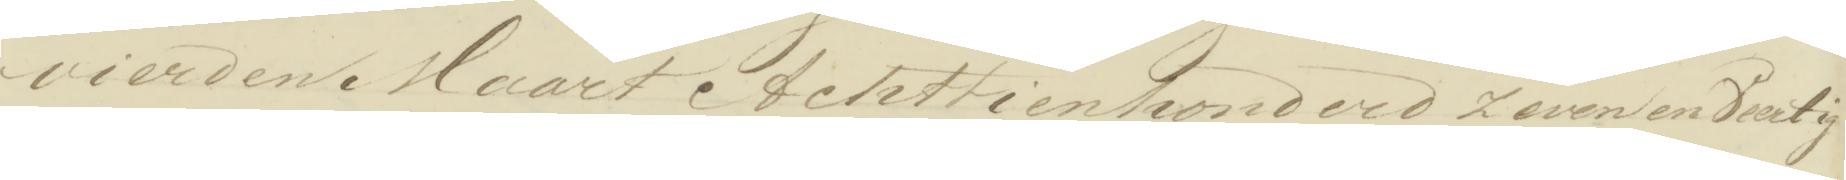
vierden Maart Achttienhonderd zeven en veertig
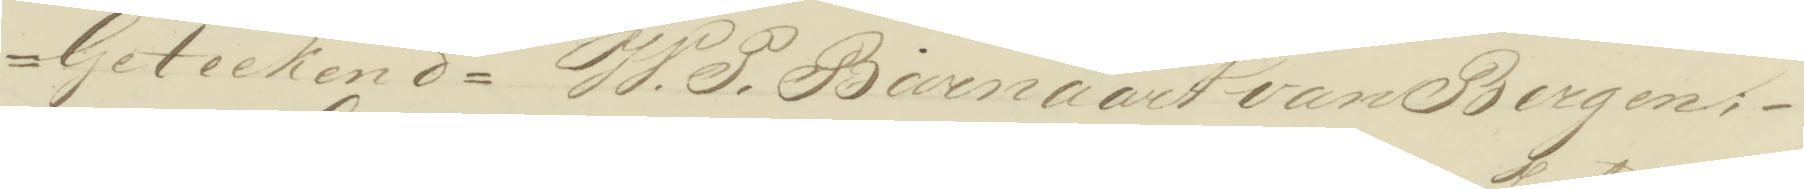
=Geteekend = W. P. Barnaart van Bergen; -
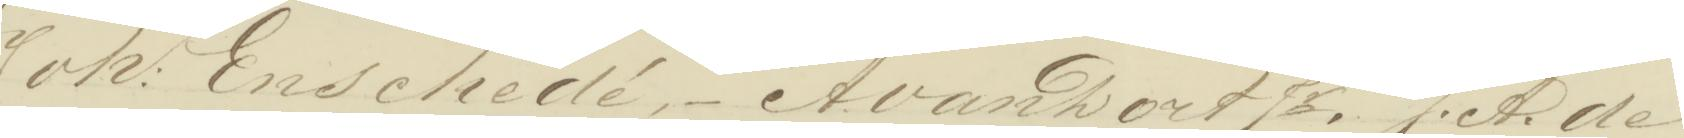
Joh: Enschedé, - A. vanDort Jr, J.A. de
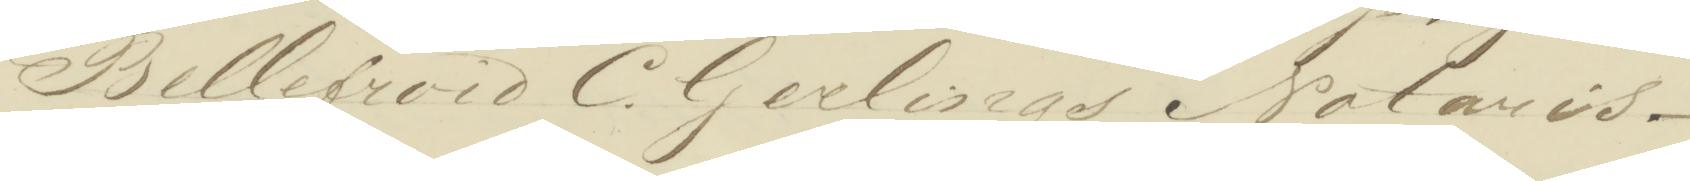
Bellefroid C. Gerlings Notaris.-
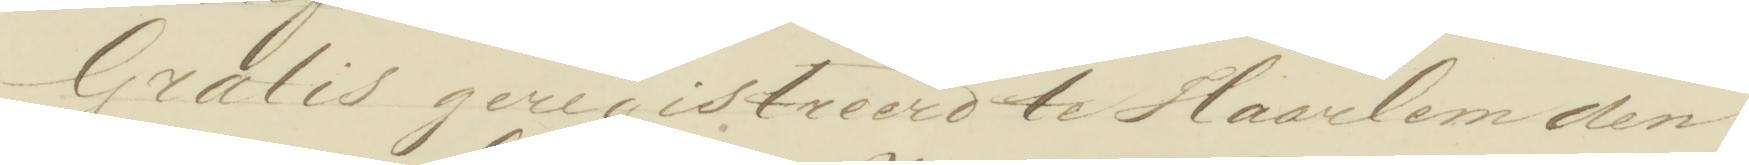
Gratis geregistreerd te Haarlem den
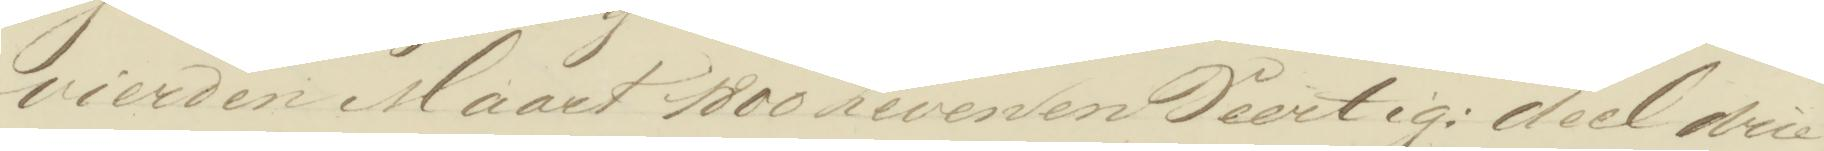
vierden Maart 1800 Zeven en Veertig: deel drie
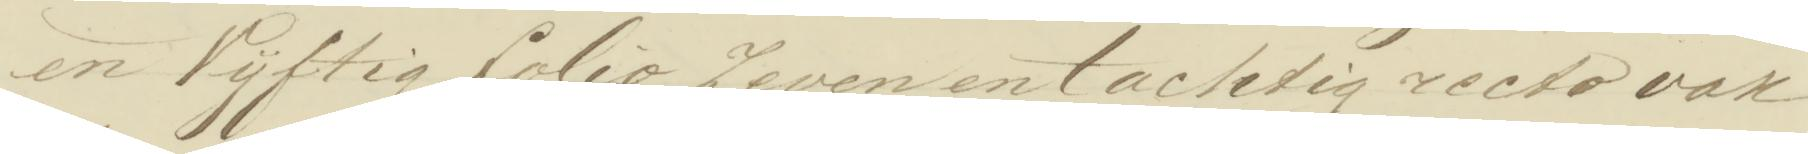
en Vijftig folio Zeven entachtig recto vak
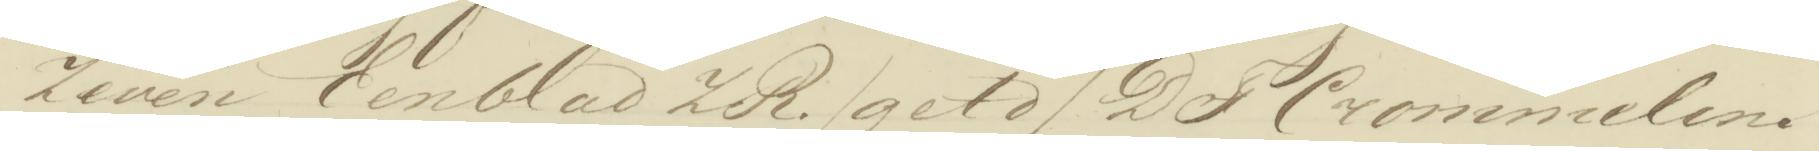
Zeven Eenblad ZR. /getd/ D F Crommelin.
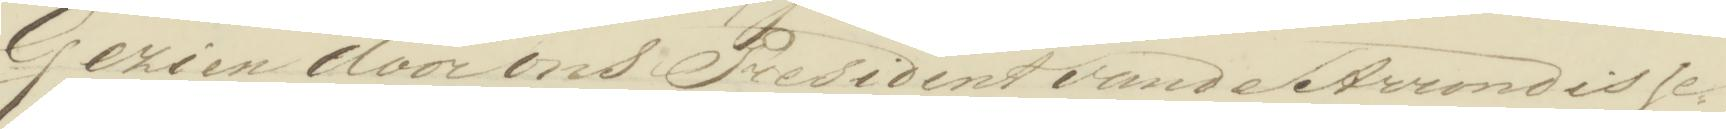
Gezien door ons President van de Arrondisse„
